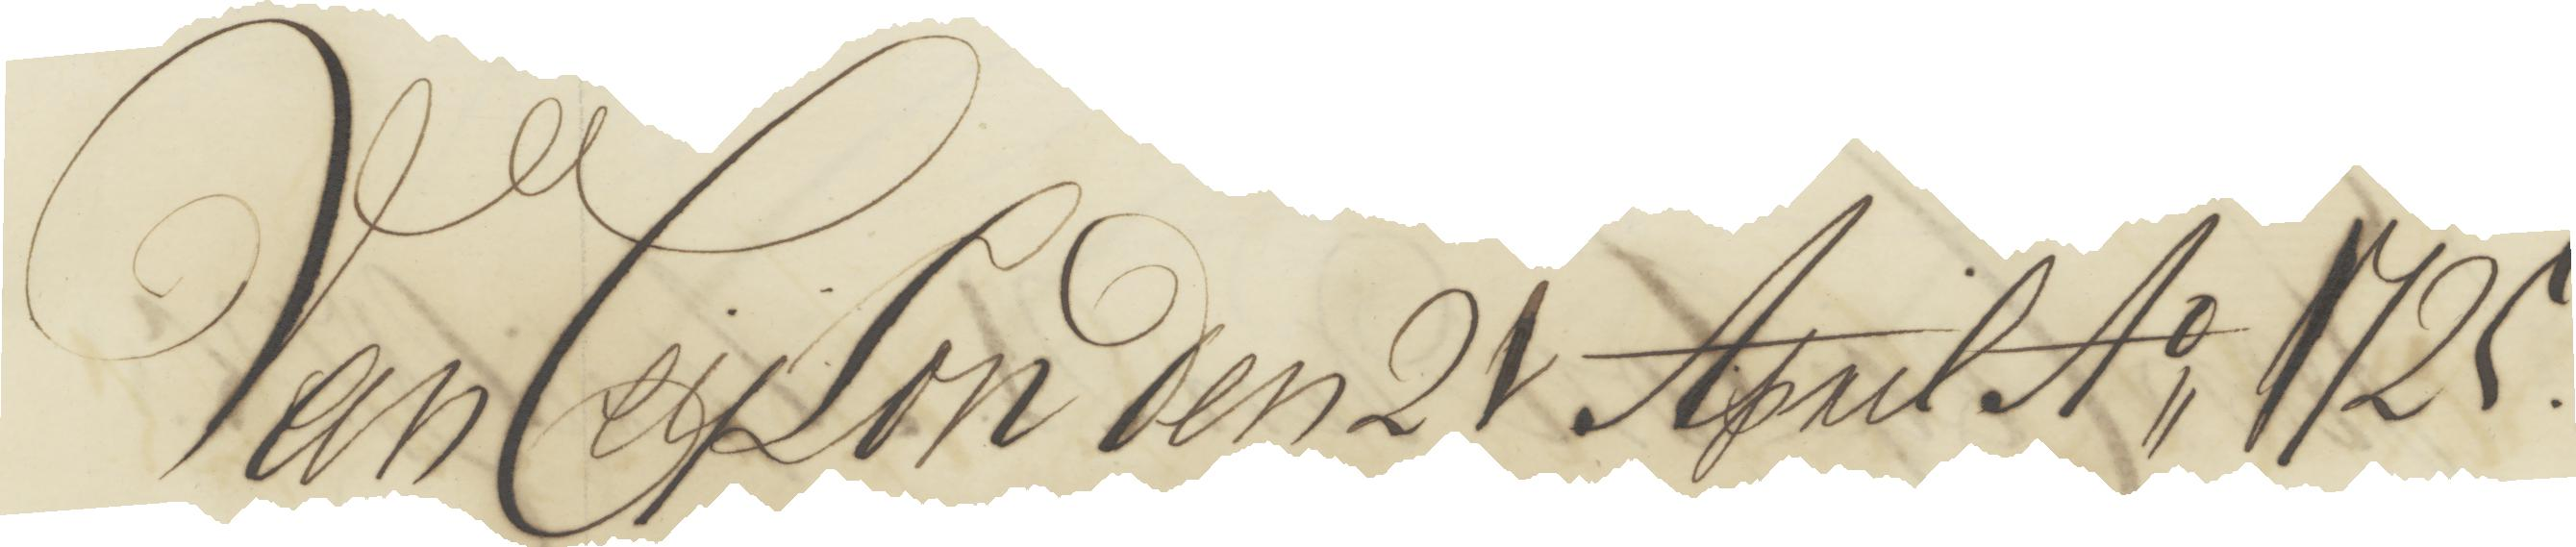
Van Ceijlon den 21 April A„o 1725.
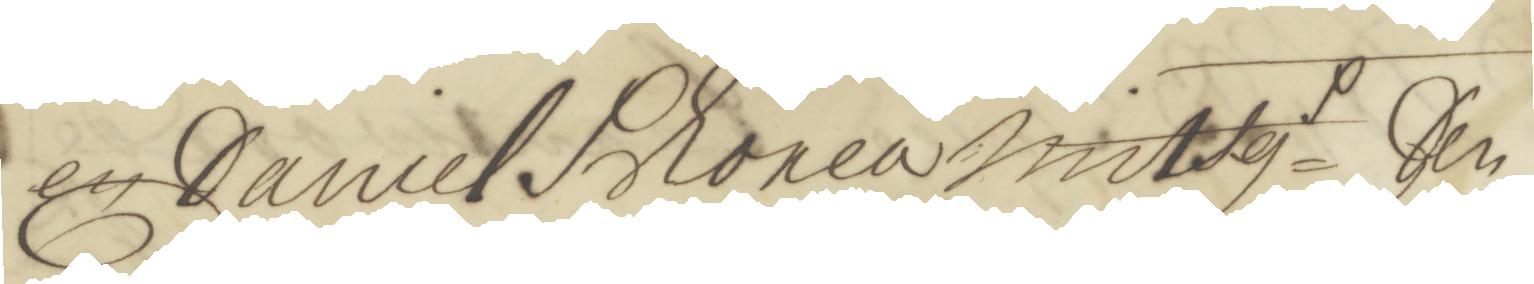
en Daniel Schorer mitsg=s den
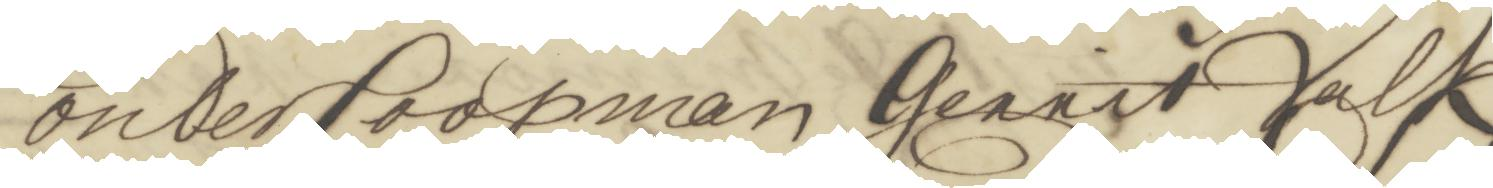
onderCoopman Gerrit Valk
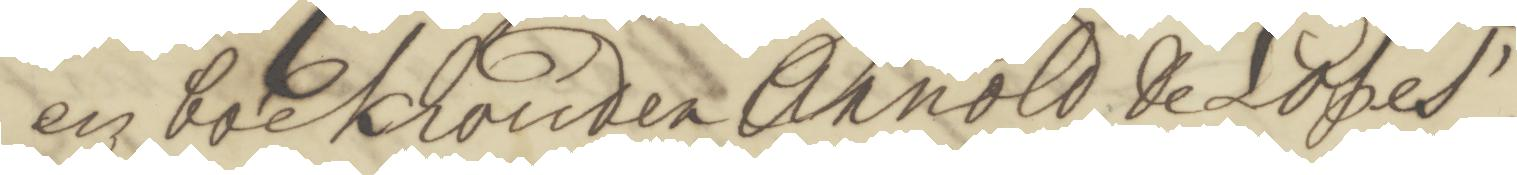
en boekhouder Arnold de Lopes'
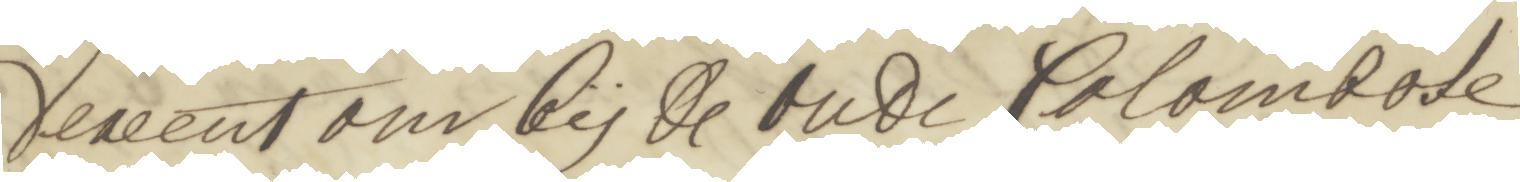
Vereent om bij de oude Colombose
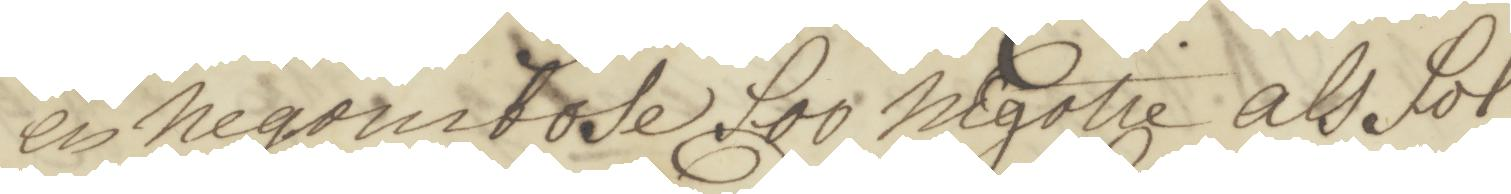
en negombose soo negotie als sol
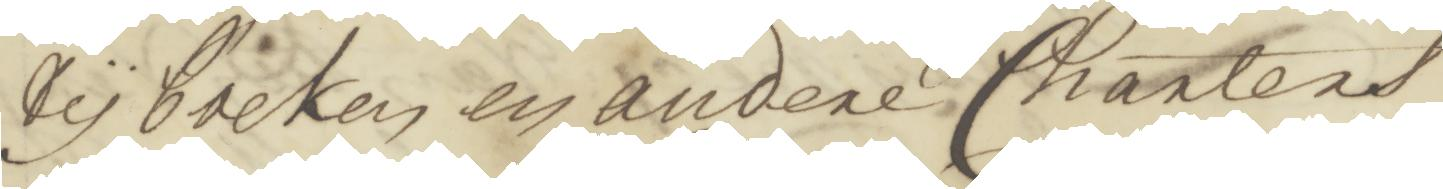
dij boeken en andere Charters
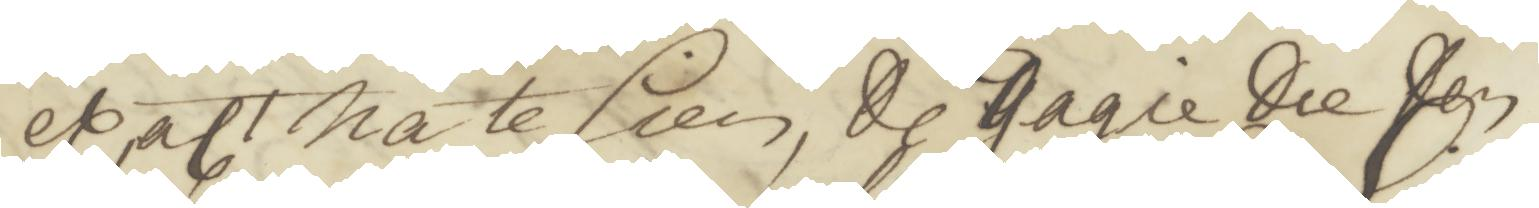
exact na te sien, de gagie die den
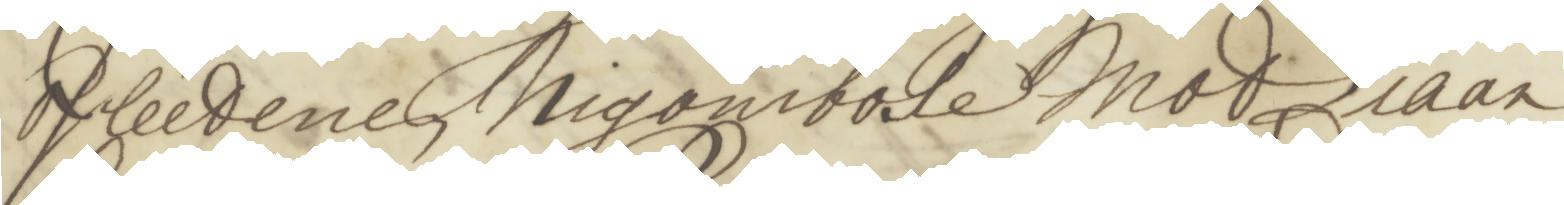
overleedenen nigombose modliaar
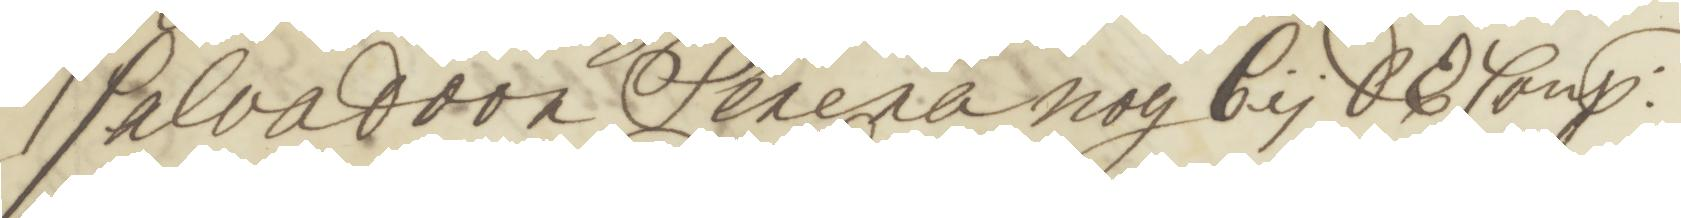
Salvadoor Perera nog bij d E Comp:
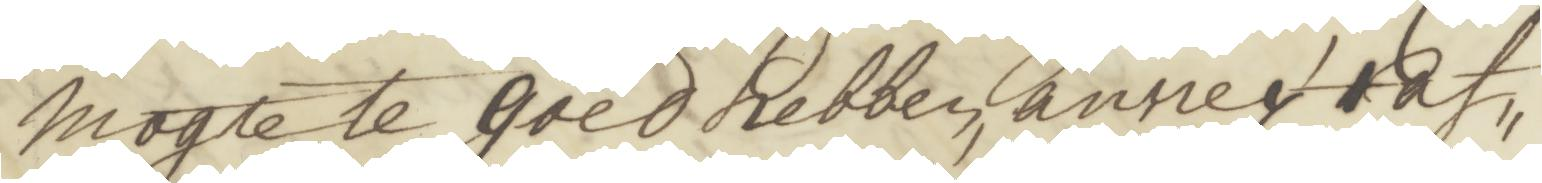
mogte te goed hebben, annex 't af„
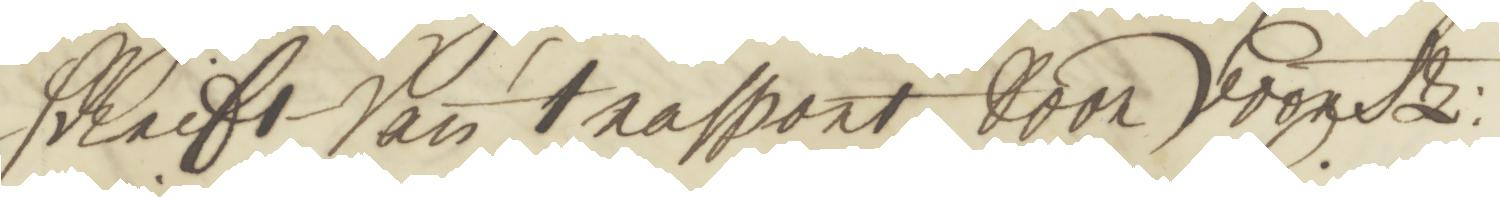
schrift van ’t rapport door voorsz:
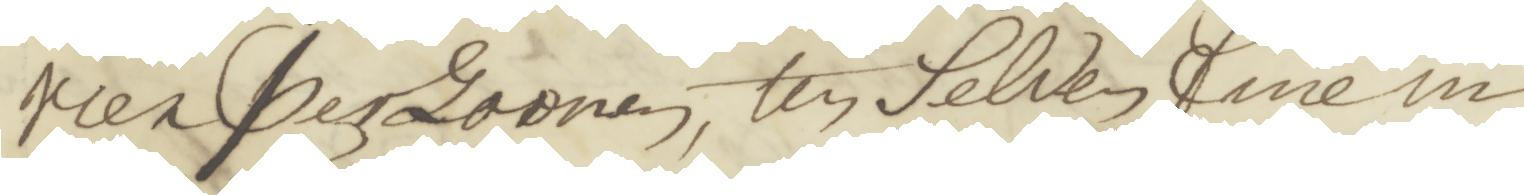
vier perzoonen, ten selven fine in
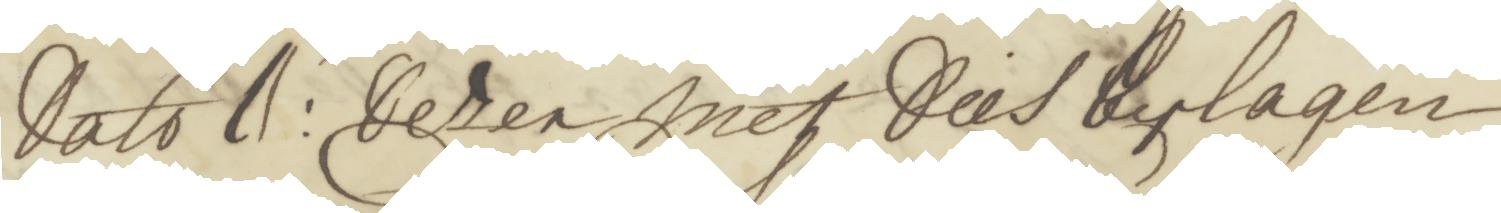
dato 4: dezer met dees bylagen,
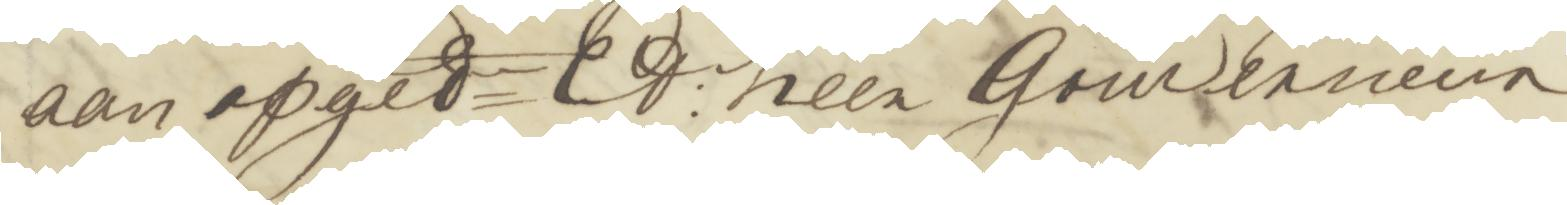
aan opged=' Ed: heer Gouverneur
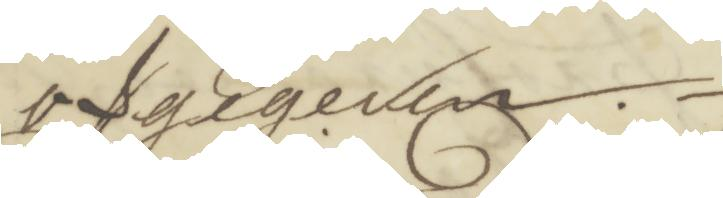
overgegeven.
